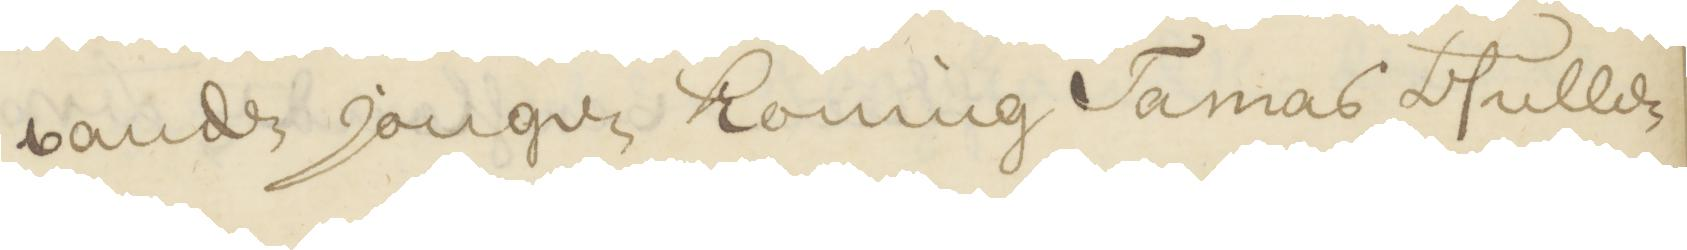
van den jongen koning Tamas tesullen
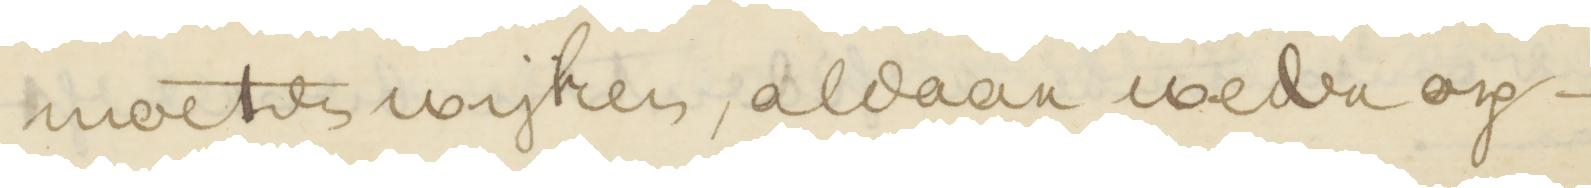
moeten wijken, aldaar weder op-
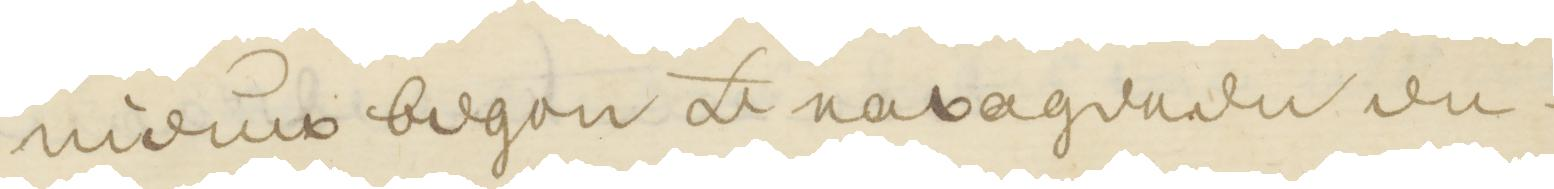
nieuw begon te ravageren en-
